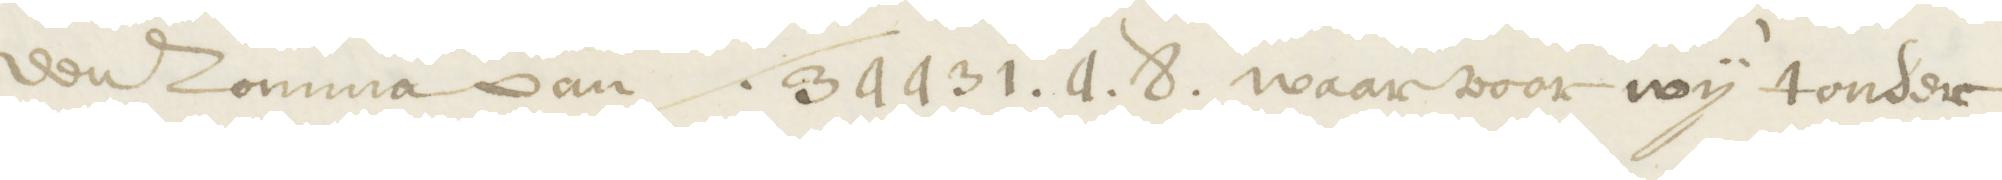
een zomma van ƒ 34431. 4. 8. waar voor wij 'tonser
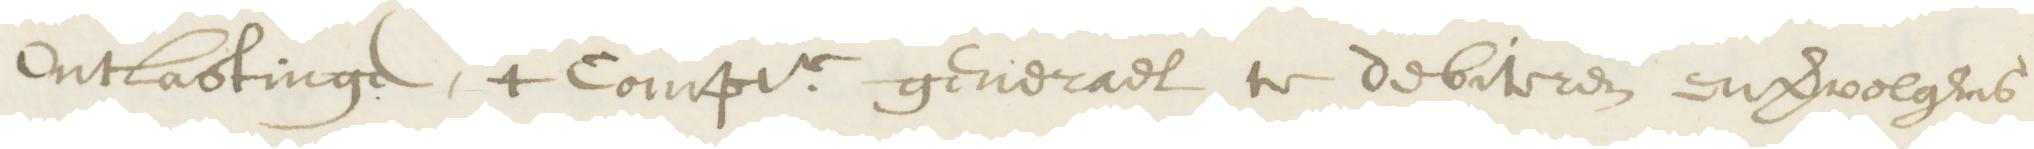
Ontlastinge, ’t Compt.r generael te debiteren en vervolgens
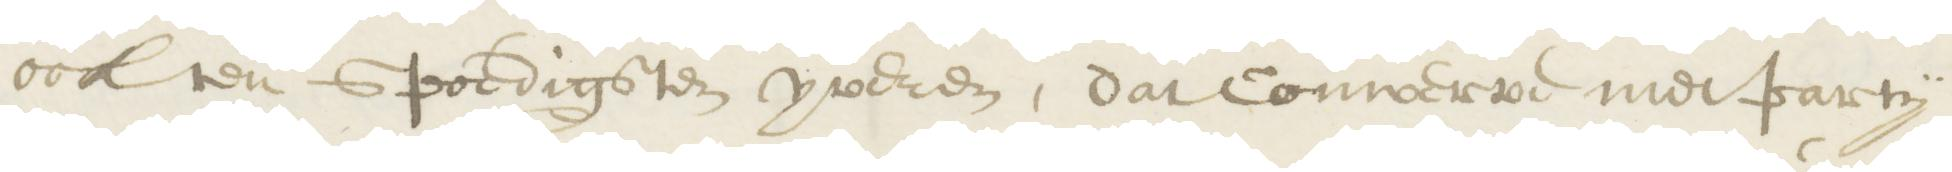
ook ten spoedigsten ijveren, dat couwerve met partij
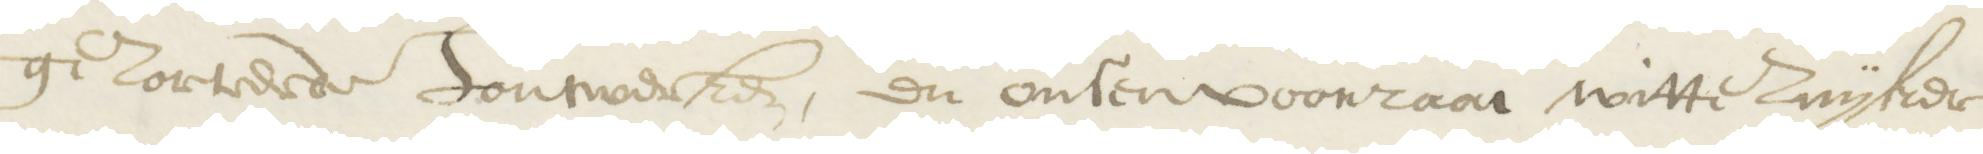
gezorteerde houtwerken, en onsen voorzaat witte zuijker
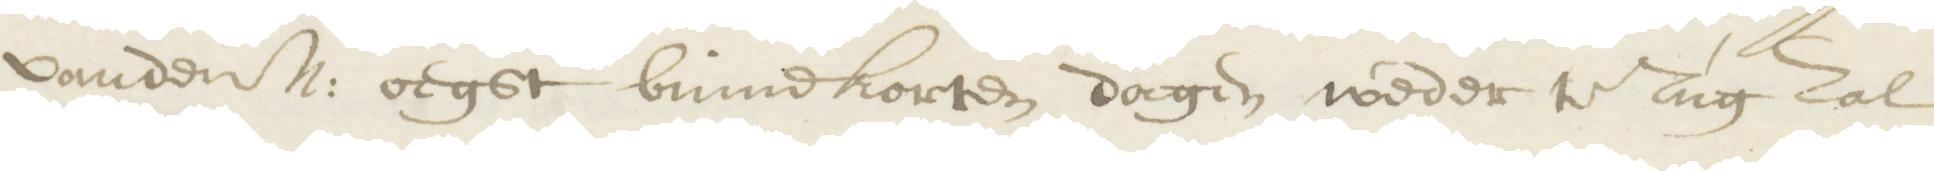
van den n: oegst binnekorten dagen weder te rug zal
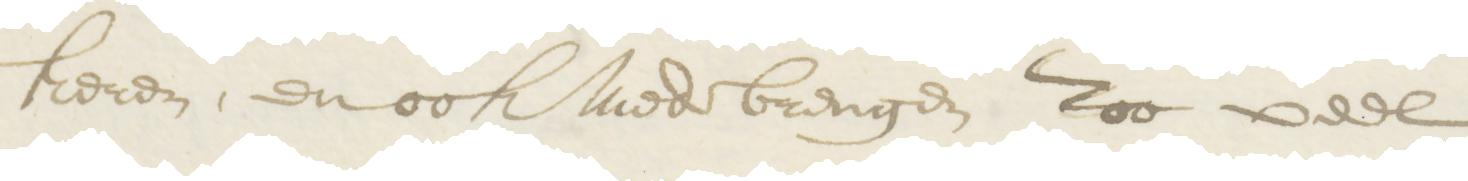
keren, en ook mede brengen zoo veel
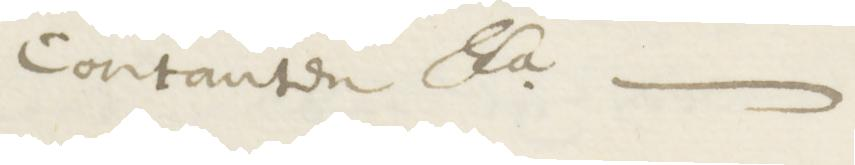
contanten etc.a —
